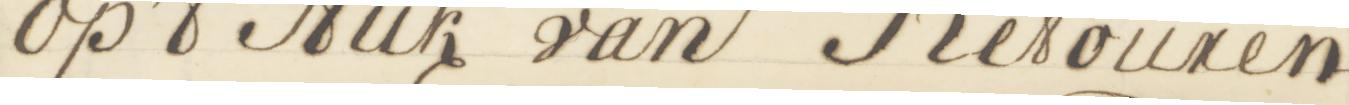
op 't Stuk van Retouren
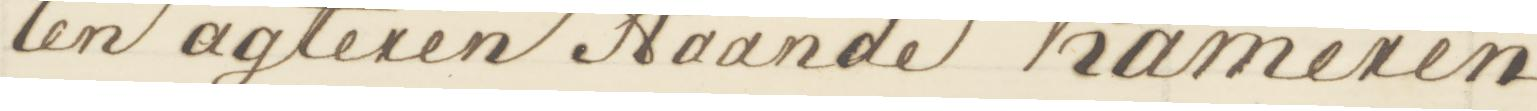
ten agteren staande T kameren
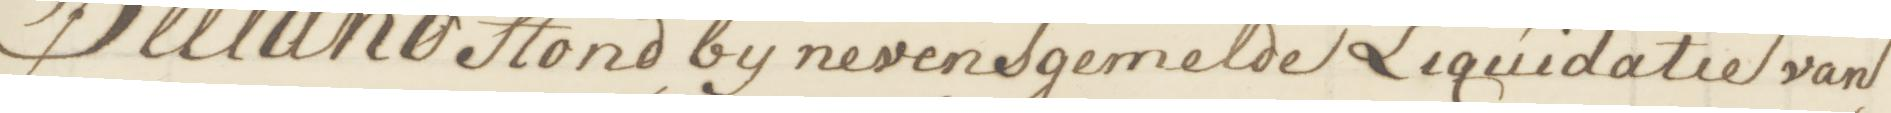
Zeeland stond by nevens gemelde Liquidatie van
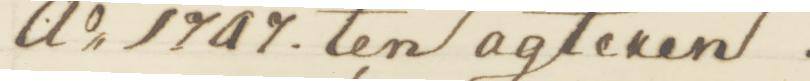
a„o 1747. ten agteren
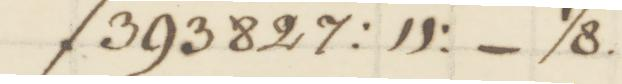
ƒ393827: 11 – 1/8.
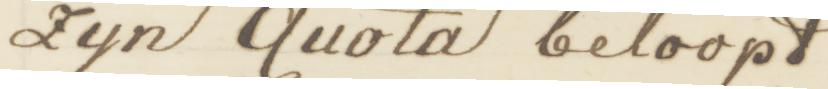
zyn quota beloopt
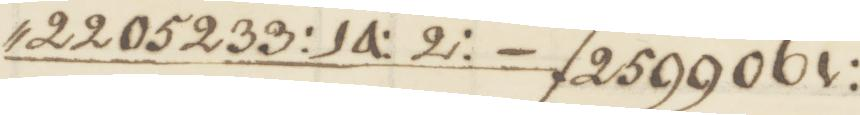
„2205233: 14: 2: – ƒ2599061:
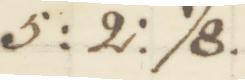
5: 2: 1/8
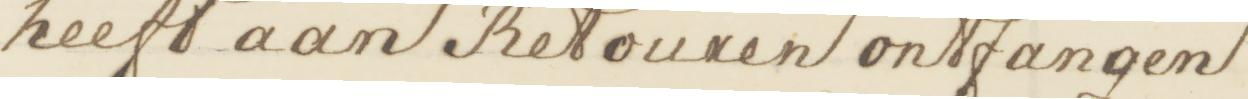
heeft aan Retouren ontfangen
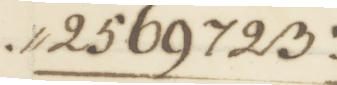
. „2569723:
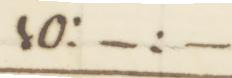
10: – : –
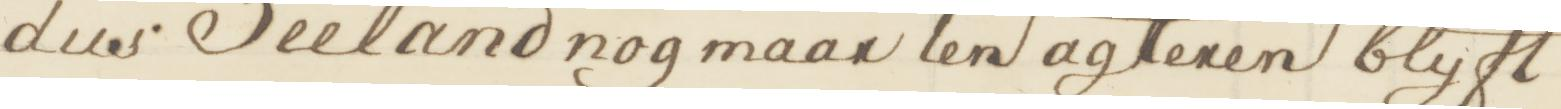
dus Zeeland nog maar ten agteren blyft
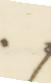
. ƒ
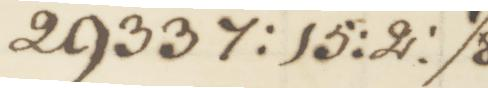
29337: 15: 2: 1/8
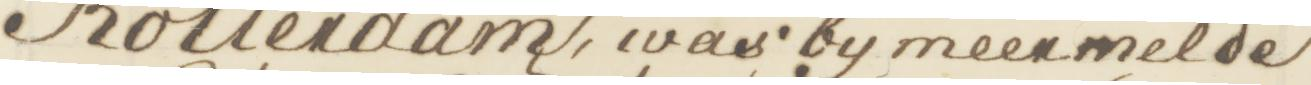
Rotterdam, was by meermelde
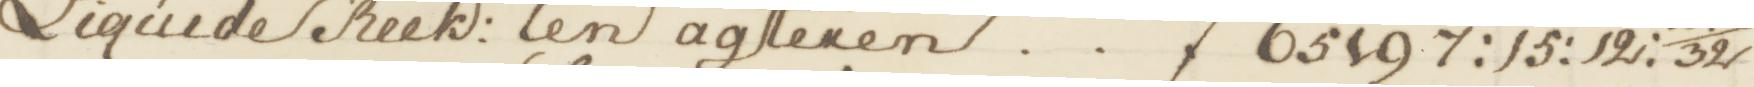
Liquide Reek: ten agteren . . ƒ 65197: 15: 12: 27/32
